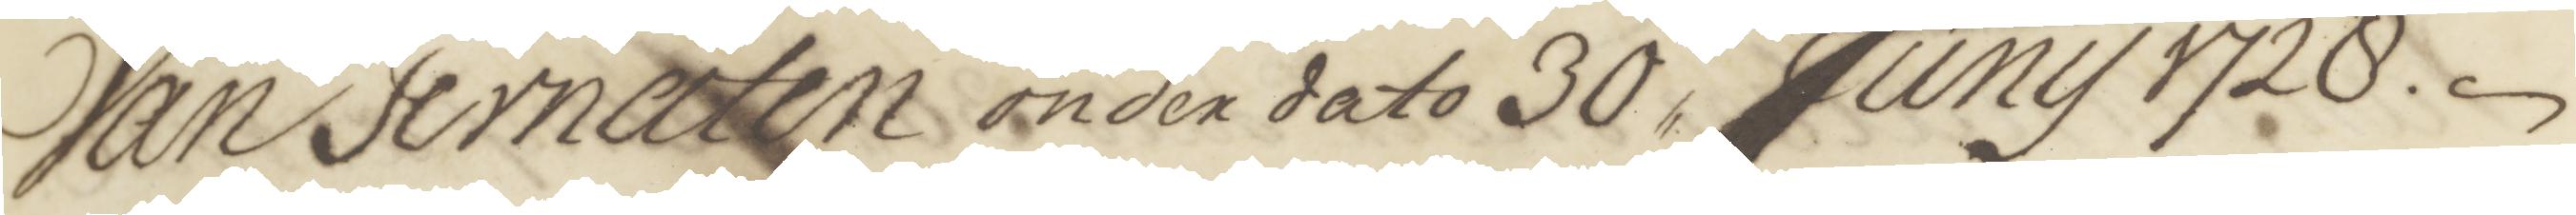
Van Ternaten onder dato 30„e Junij 1728.
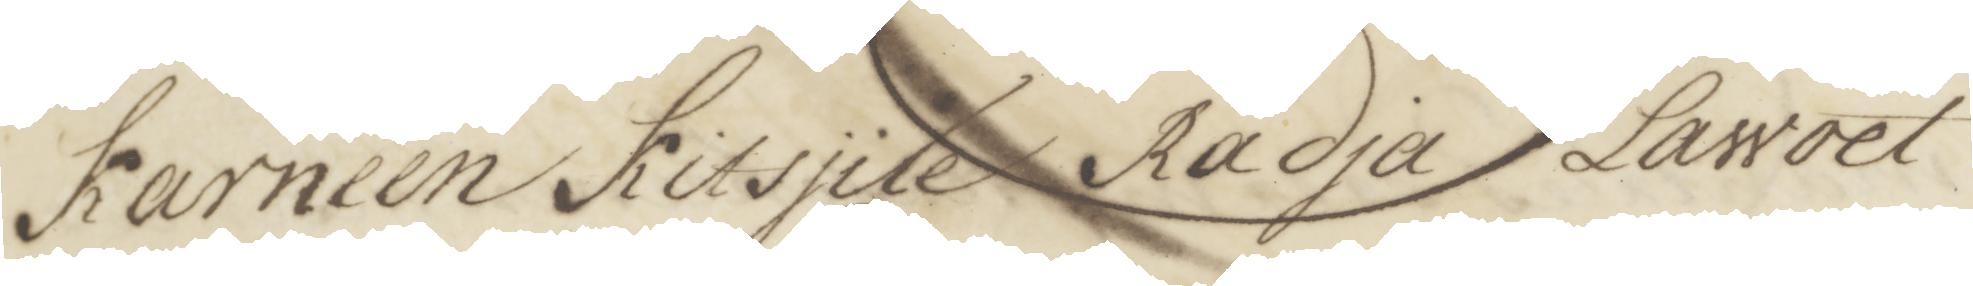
karneen kitsjite Radja Lawoet
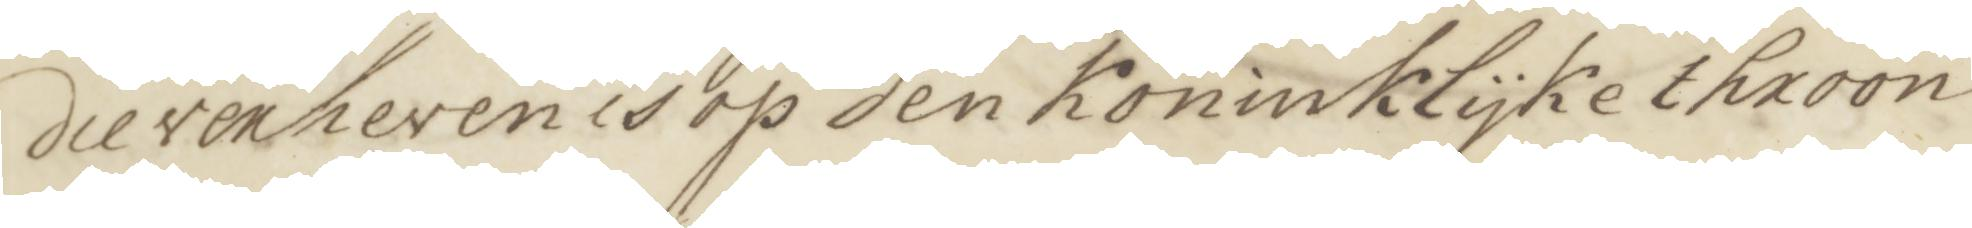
die verheven is op den koninklijke throon
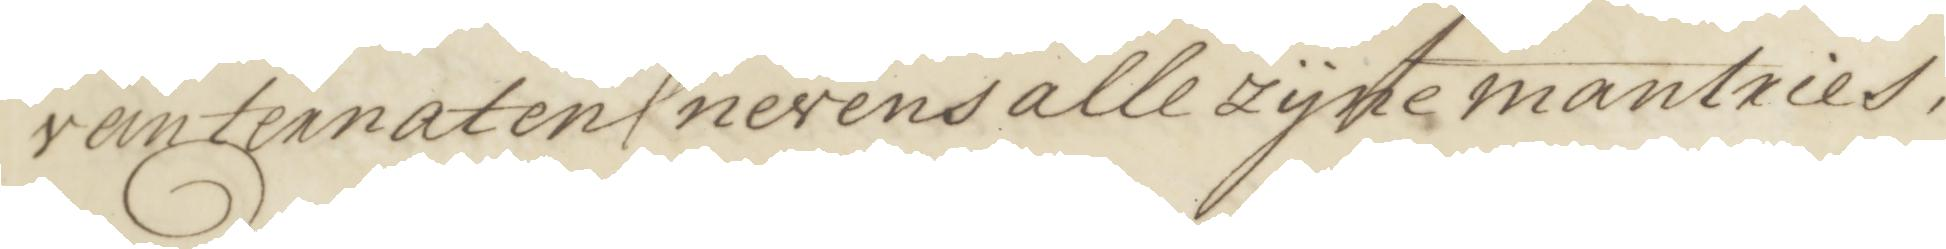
van ternatens nevens alle zijne mantries,
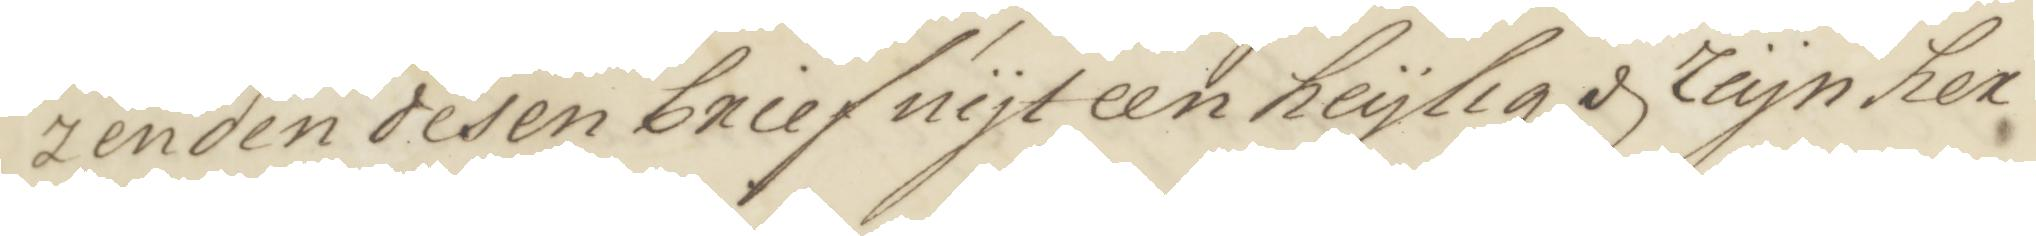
zenden desen brief uijt een heijlig en reijn her„
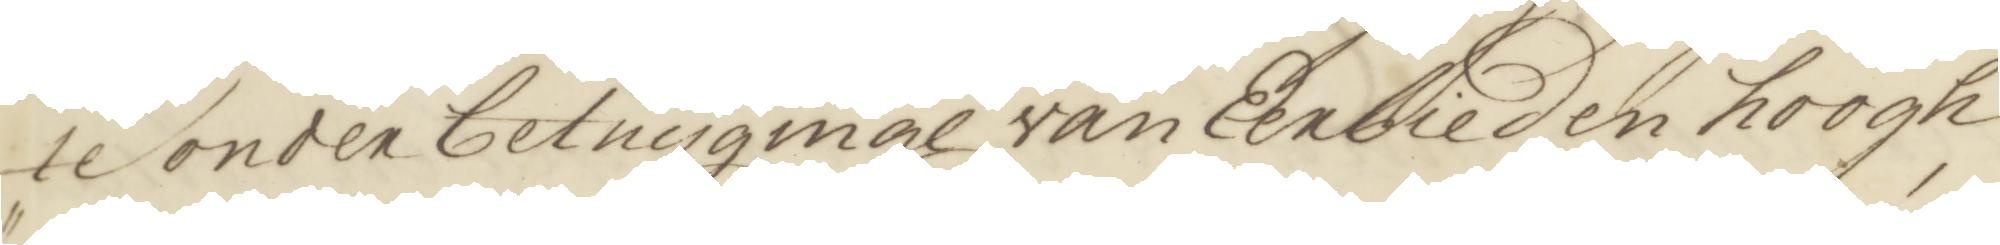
te onder betuijginge van Eerbieden hoogh
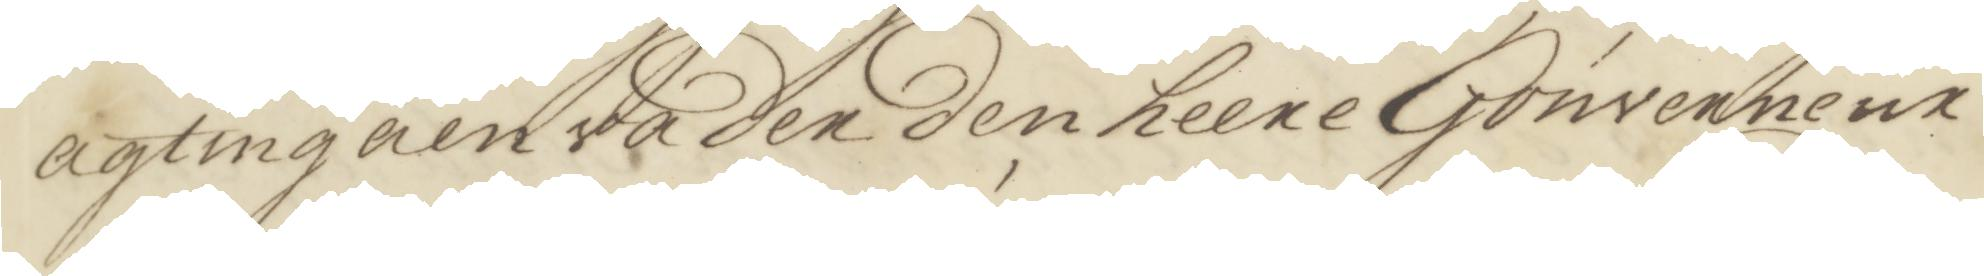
agting aen vader den heere Gouverneur
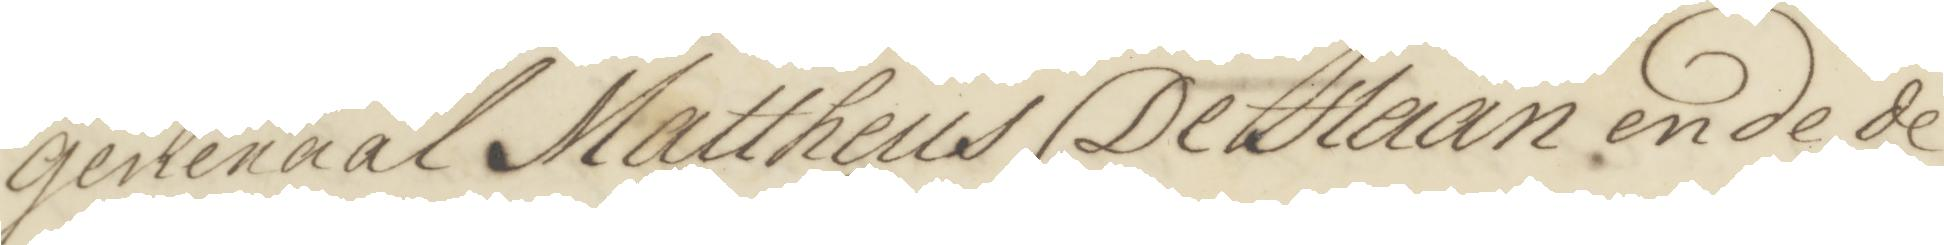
generaal Mattheus De Haan ende de
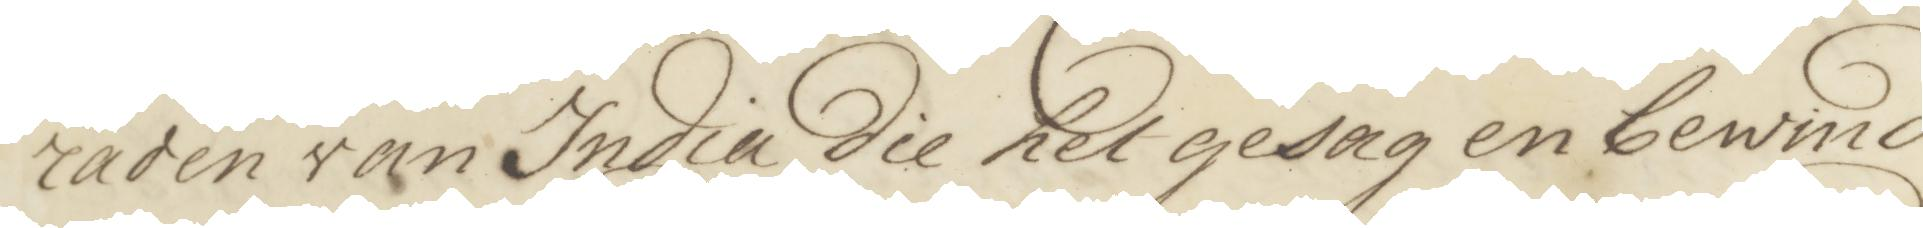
raden van India die het gesag en bewind
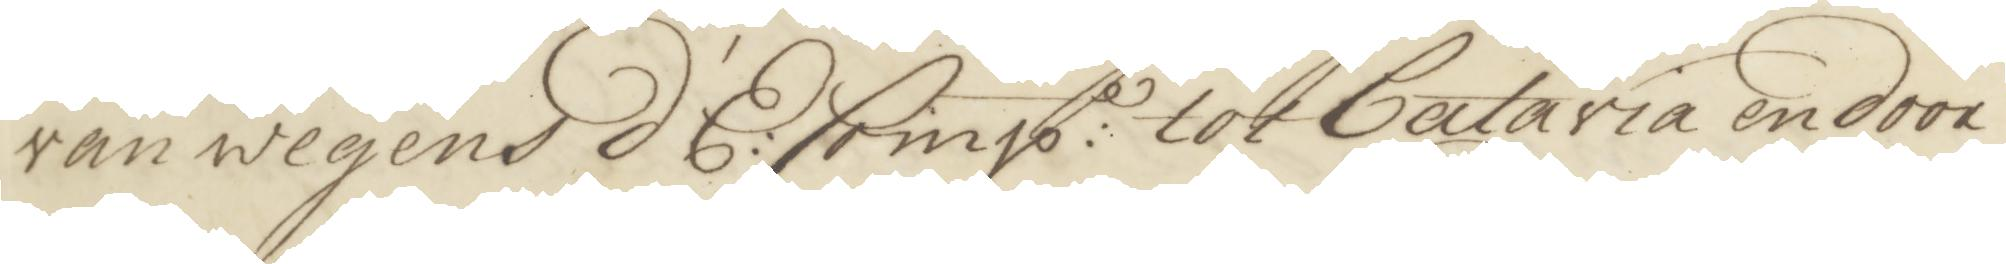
van wegens d’ E:Comp:e tot batavia en door
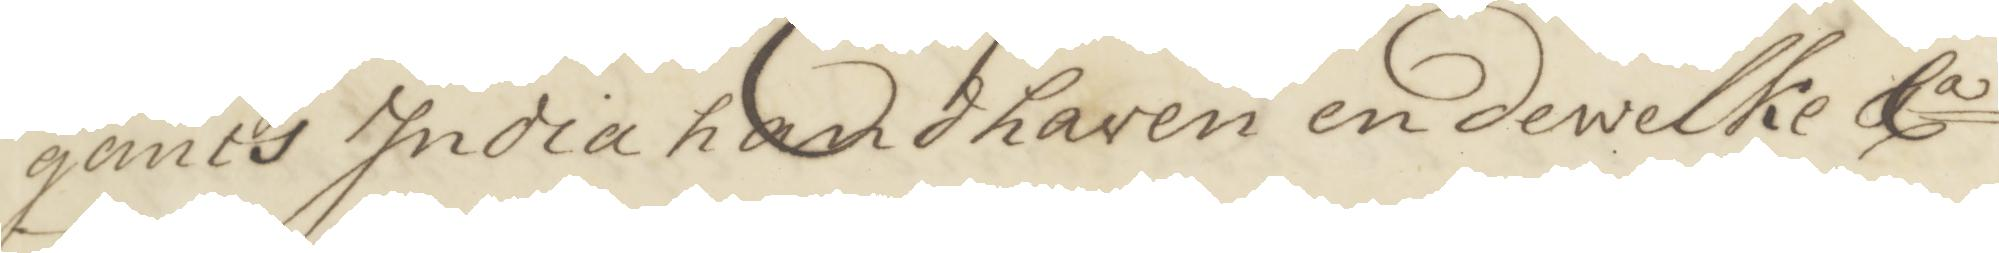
gants Jndia handhaven en dewelke Et=a
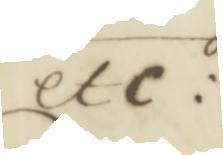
etc.a
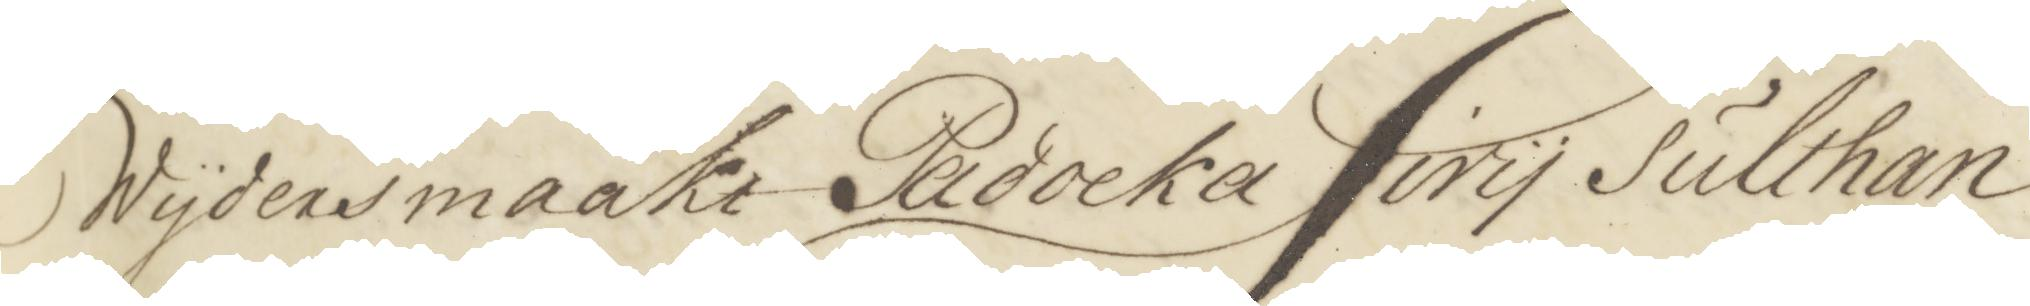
Wijders maakt Padoeka Sirij Sulthan
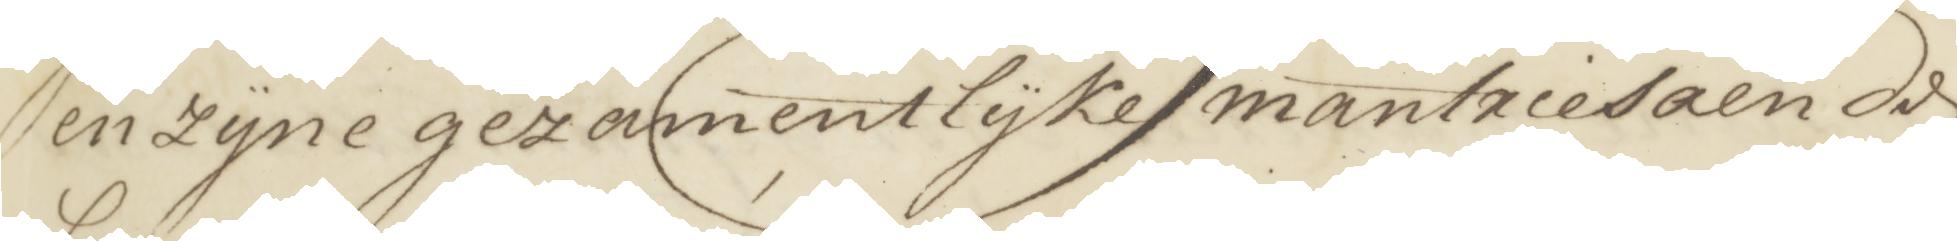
en zijne gezamentlijke mantries aen den
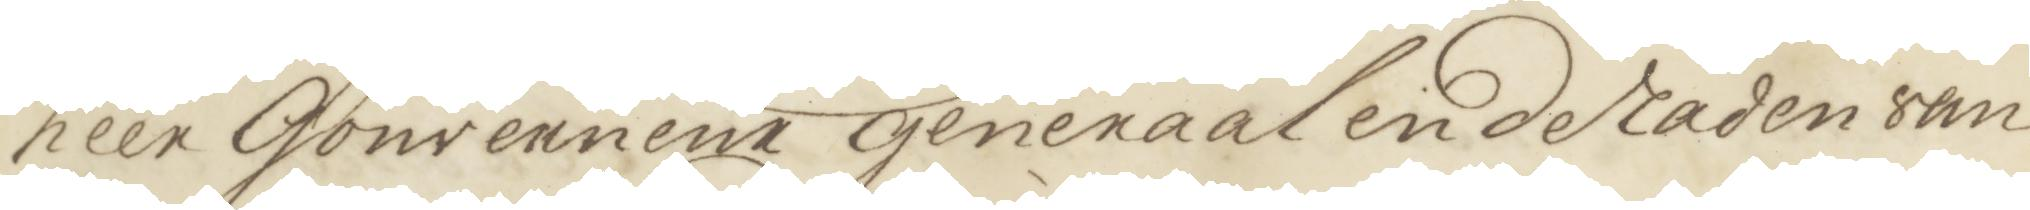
heer Gouverneur generaal en de Raden van
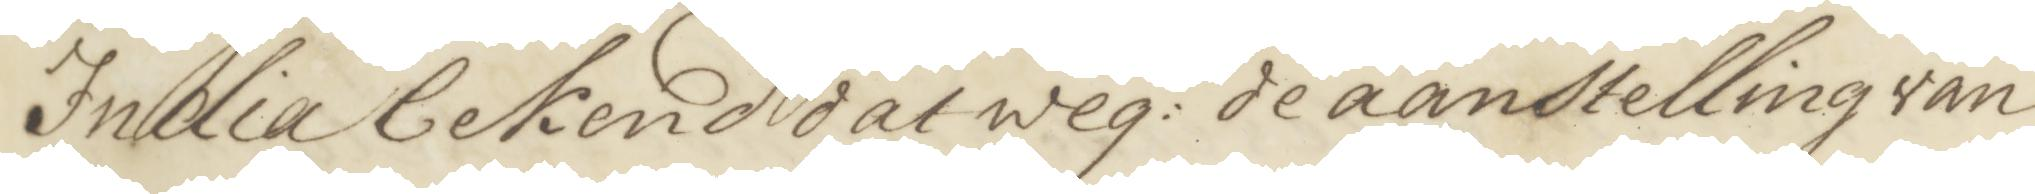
India bekend dat weg:s de aanstelling van
